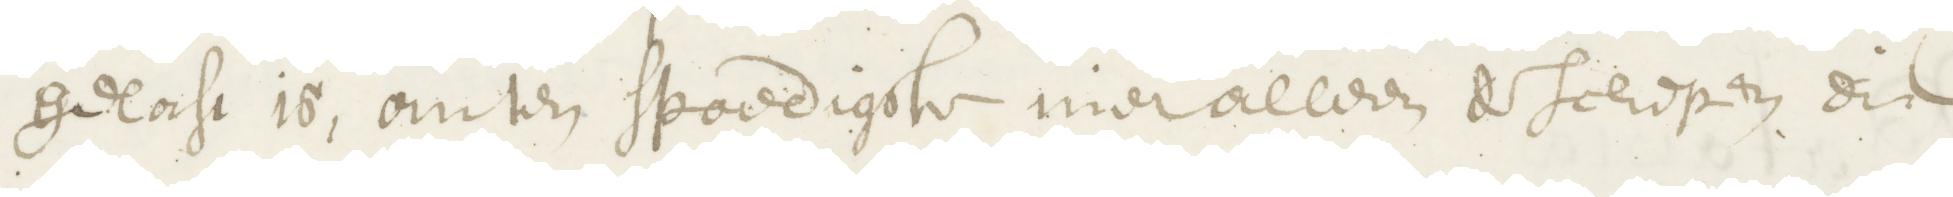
gelast is, om ten spoedigste niet alleen de schepen die
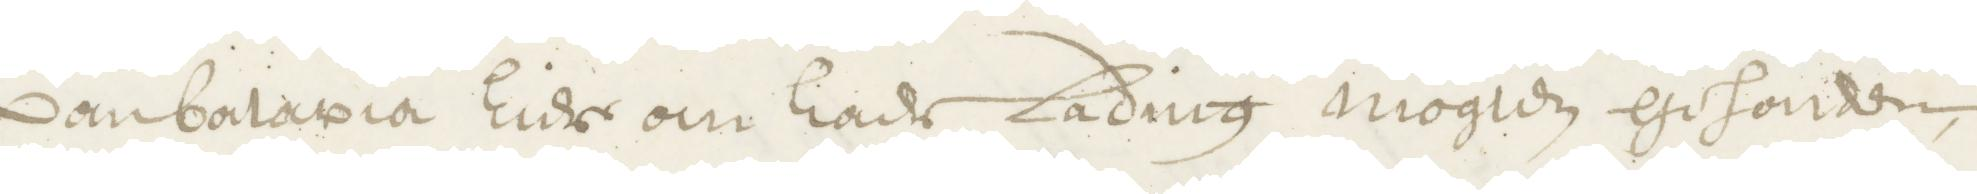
van batavia hier om haer lading mogten gesonden,
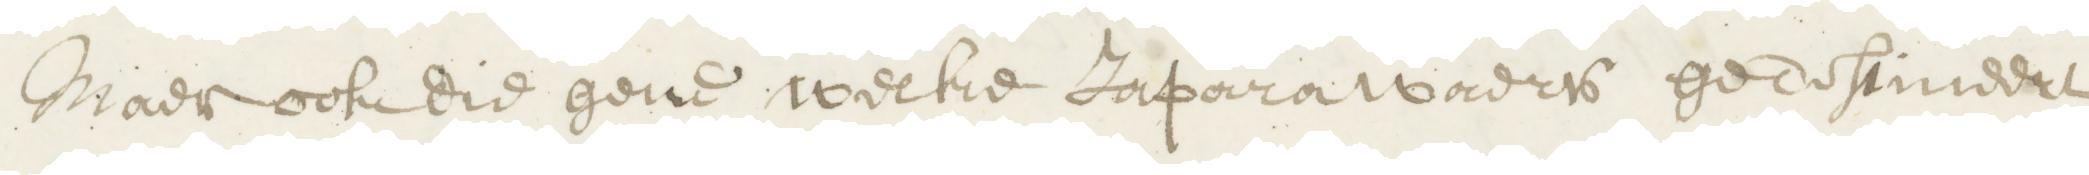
Maer ook die gene welke Iapara waerts gedestineert
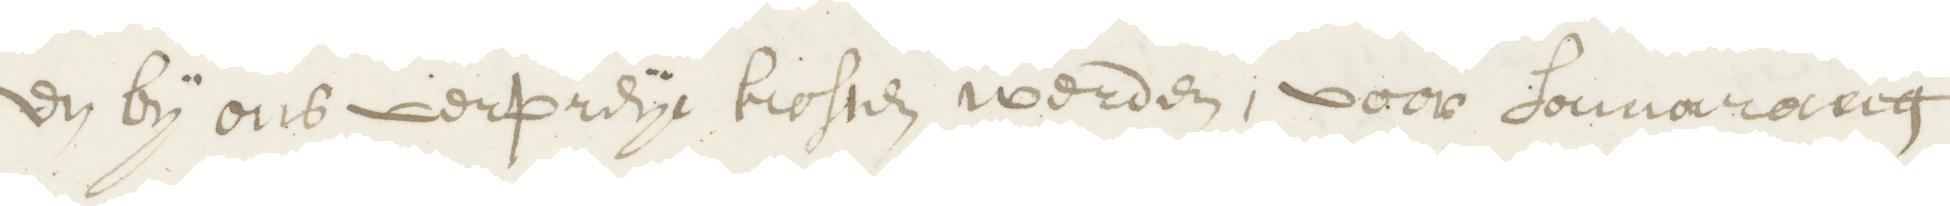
en bij ons verpreijt kosten werden, voor samarang
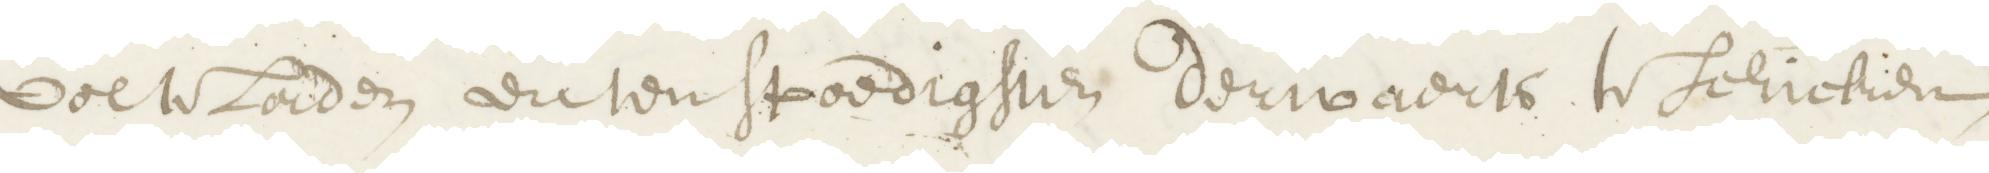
volteladen en ten spoedigsten derwaerts te schicken
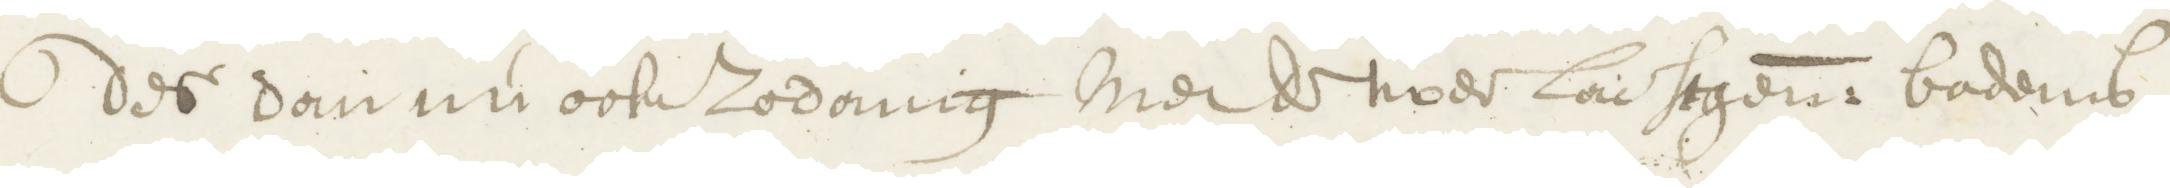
des dan nu ook zodanig met de twee laestgen: bodems
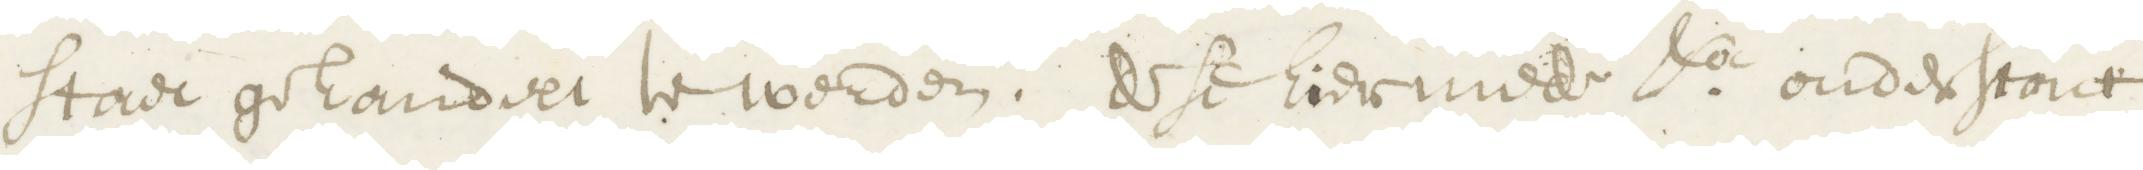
staet gehandelt te werden. dese hiermede &:a onderstont
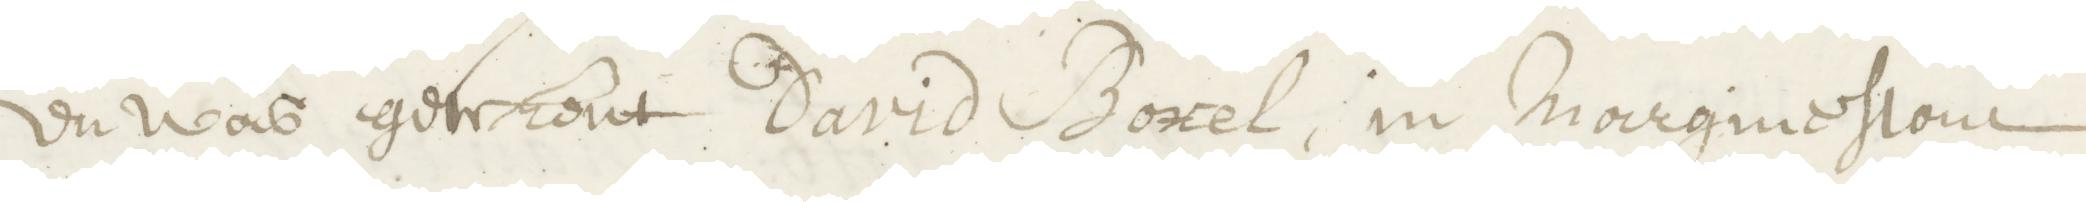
en was getekent David Boxel, in margine stont
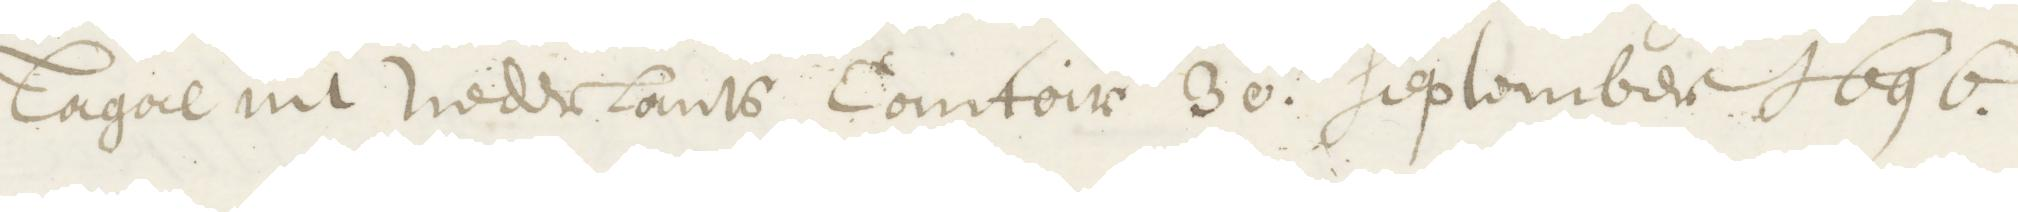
Tagal in't Nederlants Comtoir 30:en september 1696.
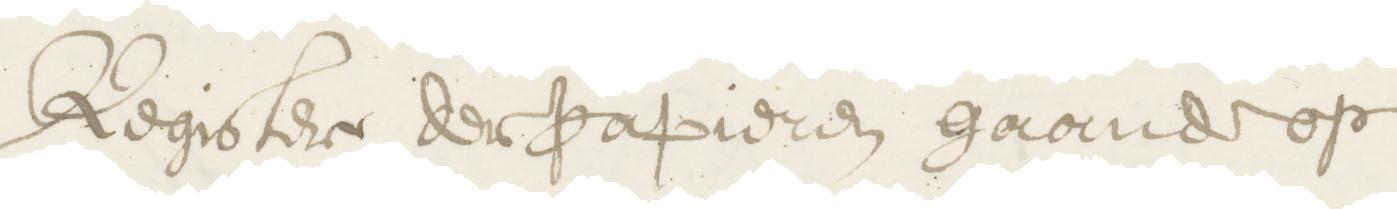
Register der papieren gaande op
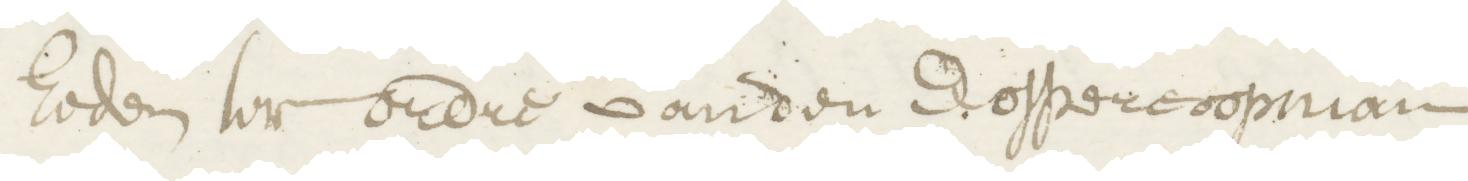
heden ter ordre van den E. oppercoopman
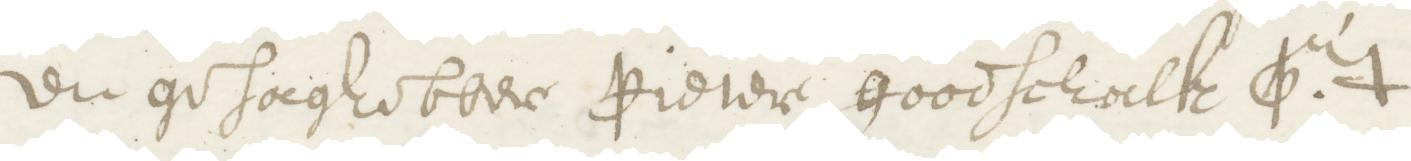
en gesaghebber Pieter goodschalk p:r 't
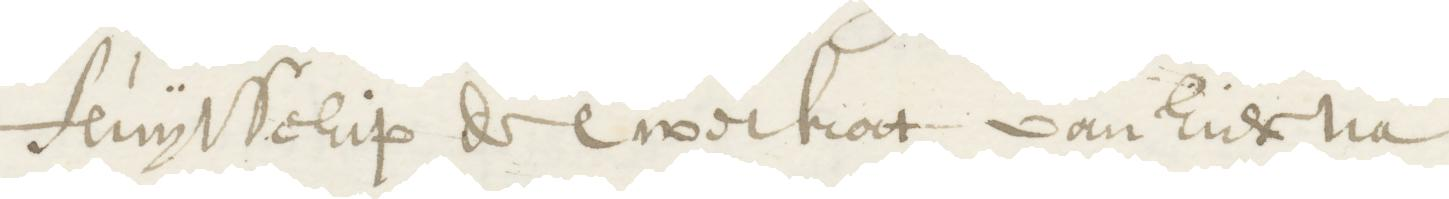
fluijtschip de Civetkat van hier na
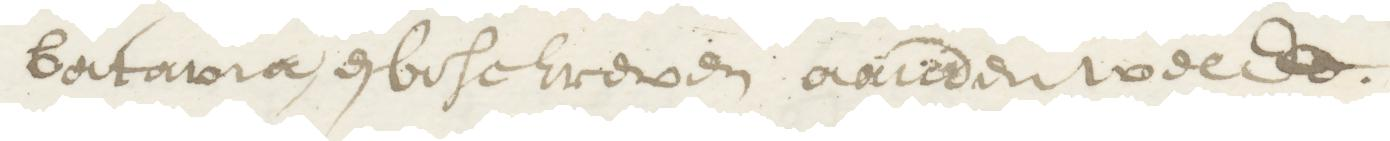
batavia en beschreven aanden wel Ed.
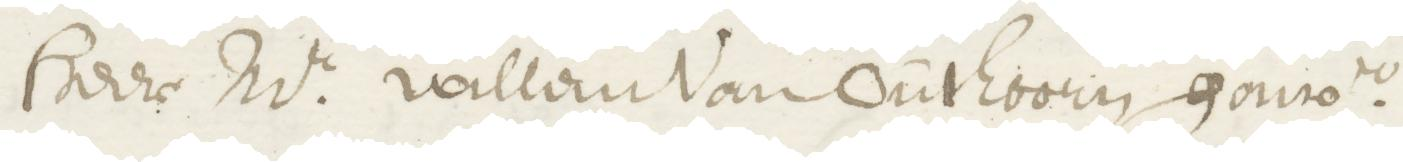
Heer M.r willem Van Outhoorn gouv.r
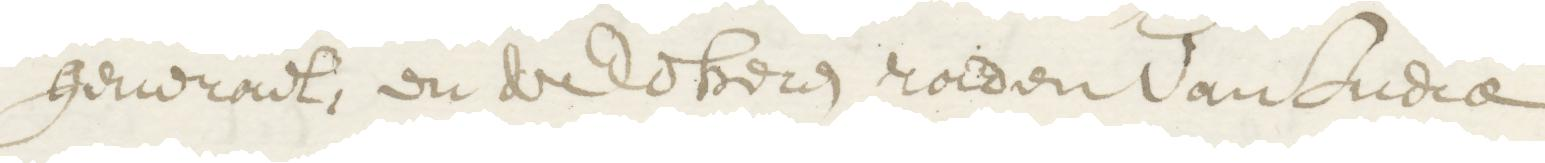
generael, en de Ed heren raden Van India
